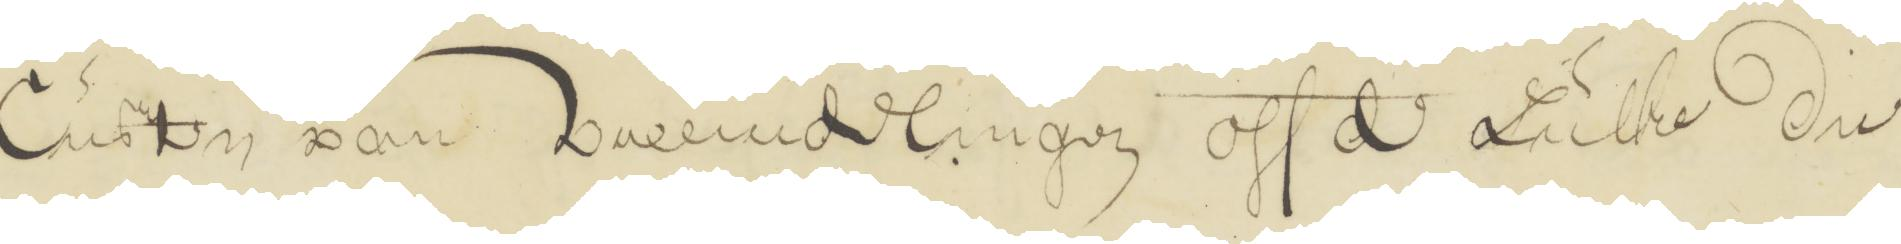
Custen van vreemdelingen off de zulke die
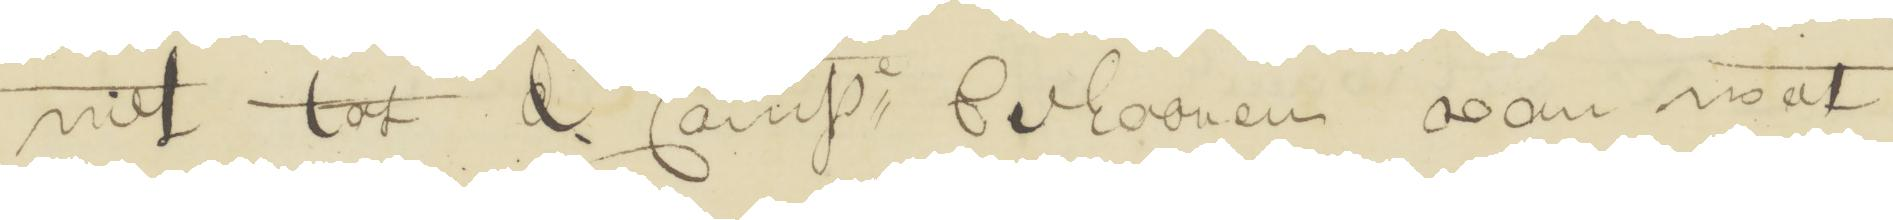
niet tot dE Comp„e behooren van wat
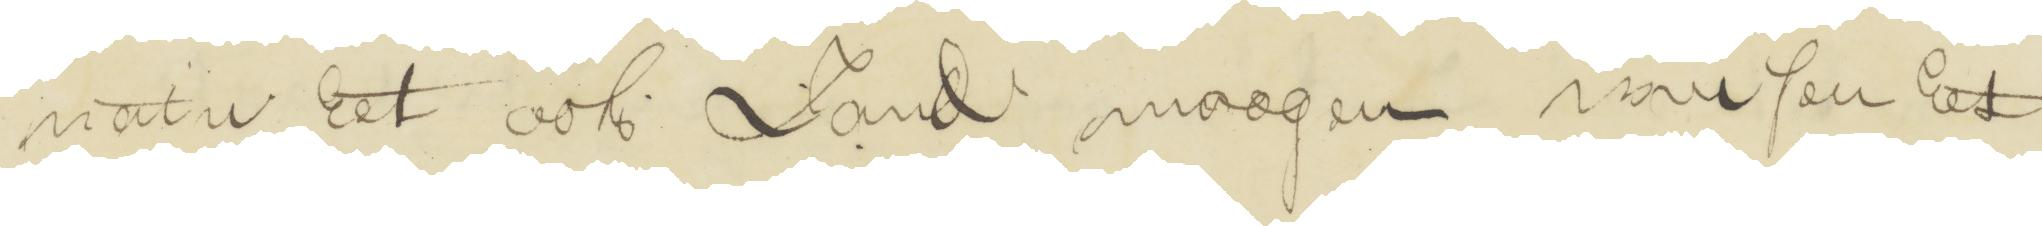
natie het ook zoude moegen weesen het
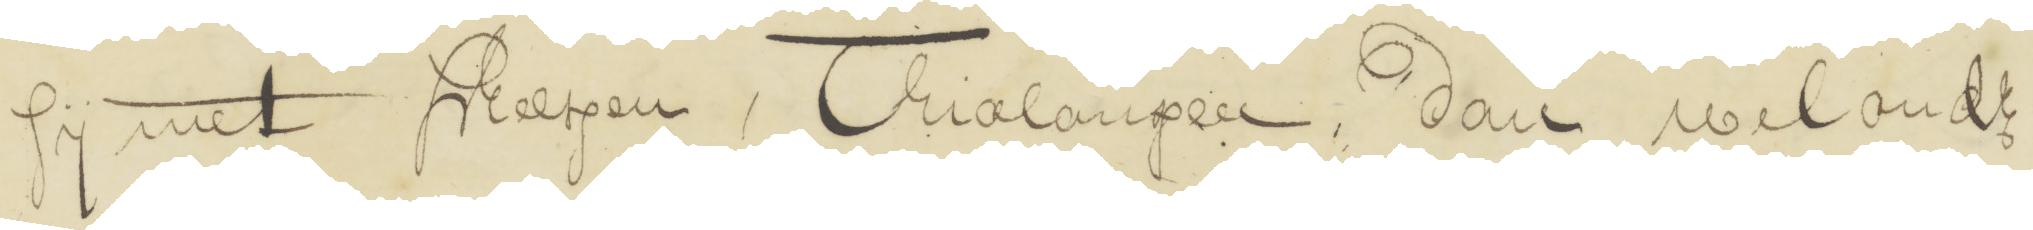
sij met scheepen, Chialoupen, dan wel ander
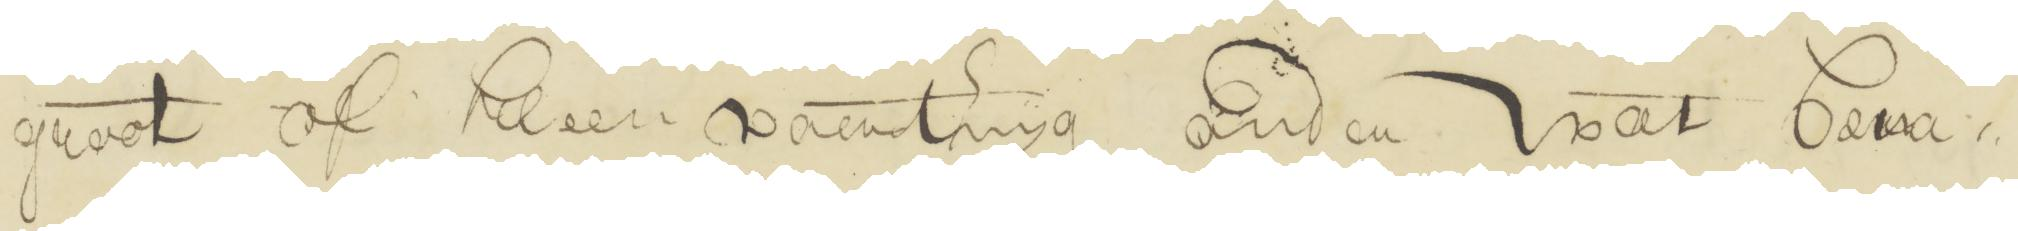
groot of kleen vaertuijg onder wat bena„
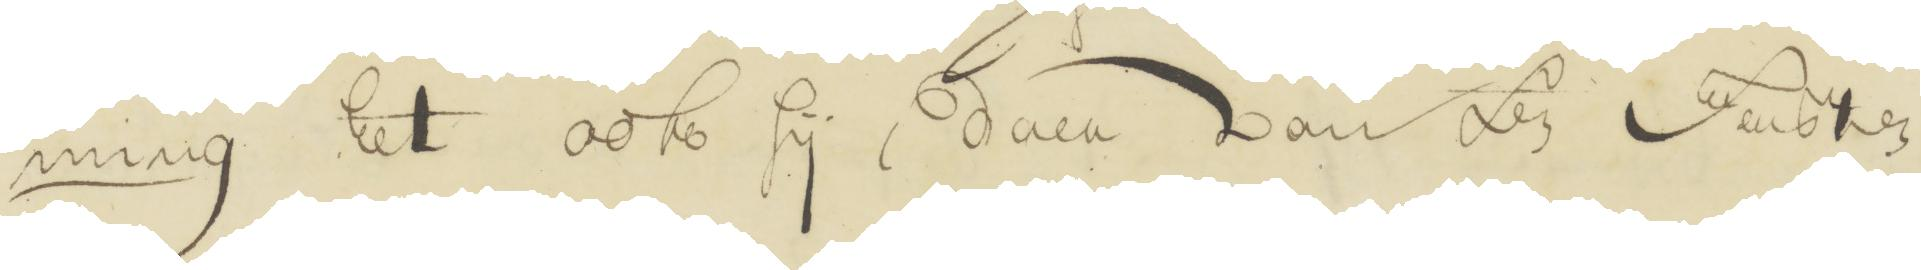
ming het ook sij, daer van ten Eensten
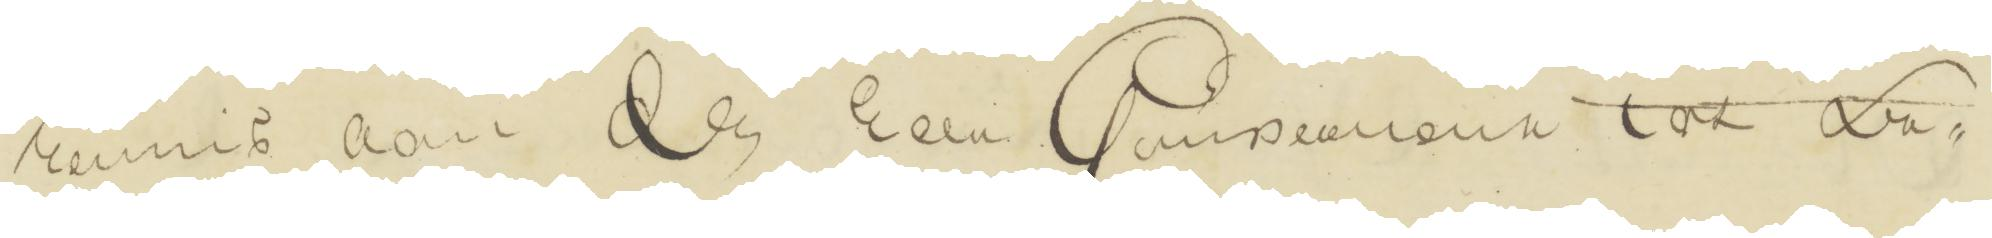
kennis aan den heer Gouverneur tot ter„
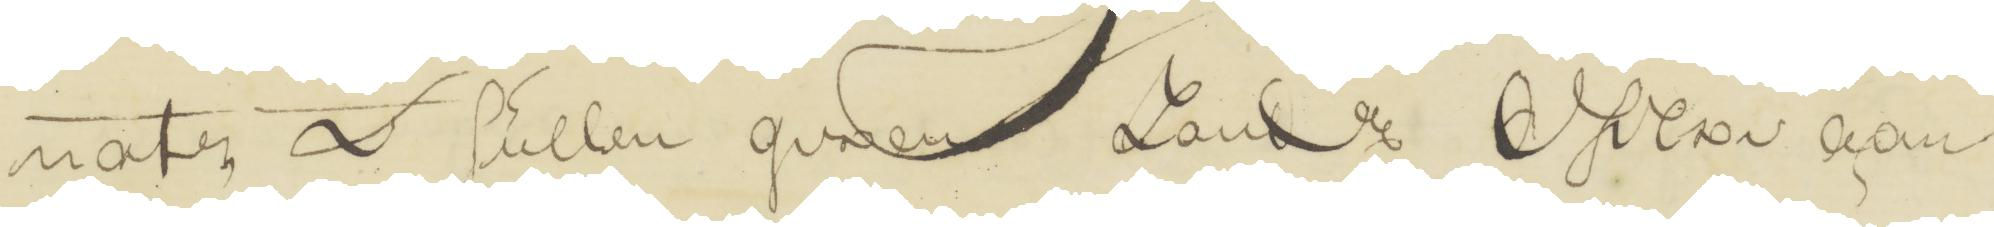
naten te sullen geven zonder deselve aan
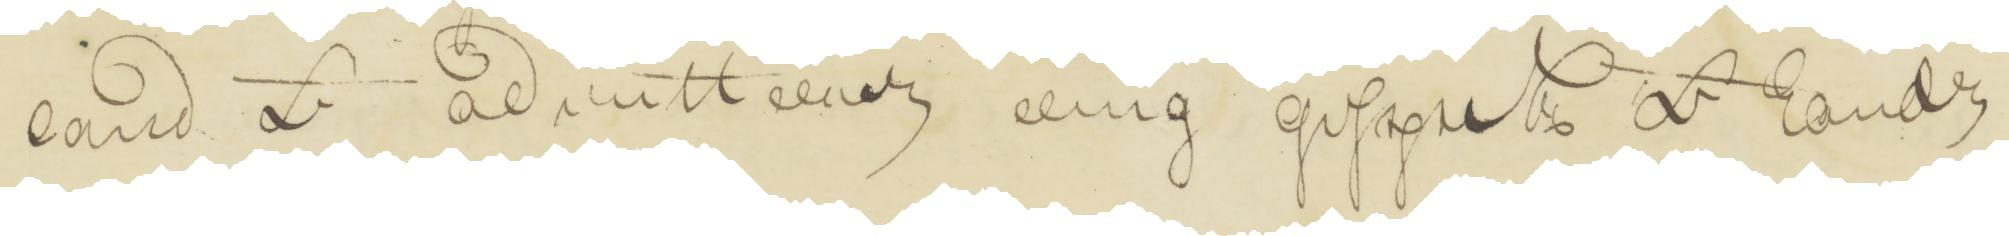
land te admitteeren eenig gesprek te houden
